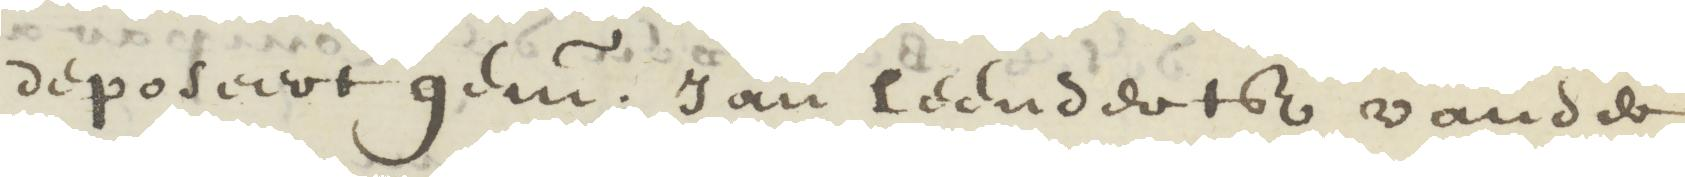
deposeert gem: Jan leendertsz vander
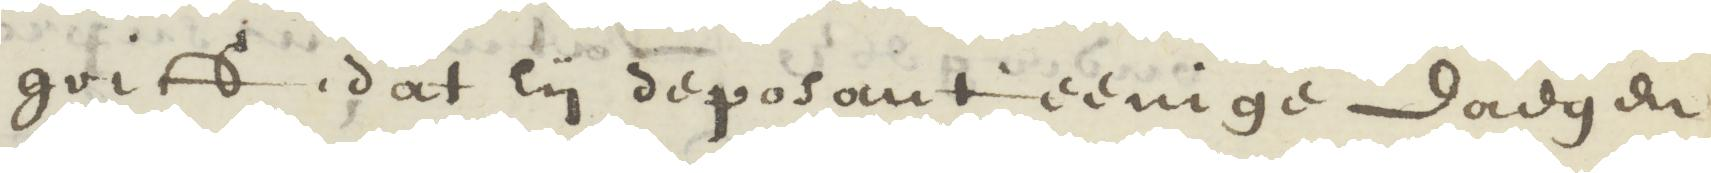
grift, dat hij deposant eenige Daegen
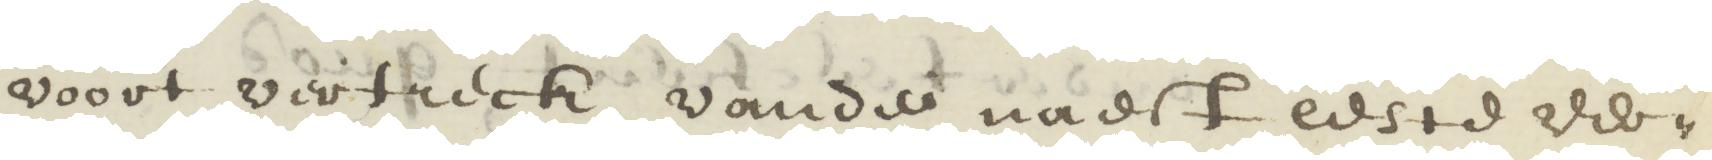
voort vertreck van de naest leste ver„
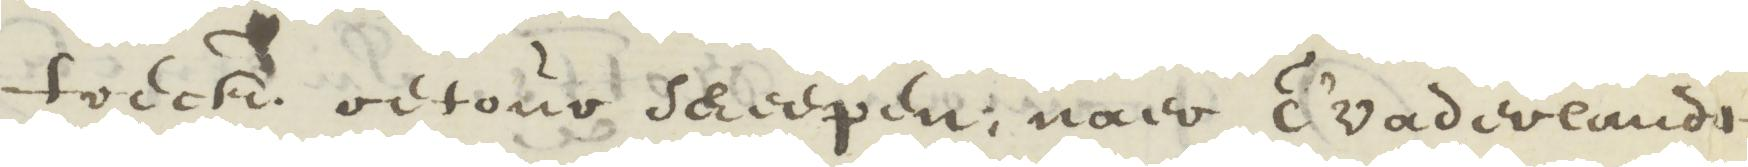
treck retour scheepen; naer T'Vaderlandt
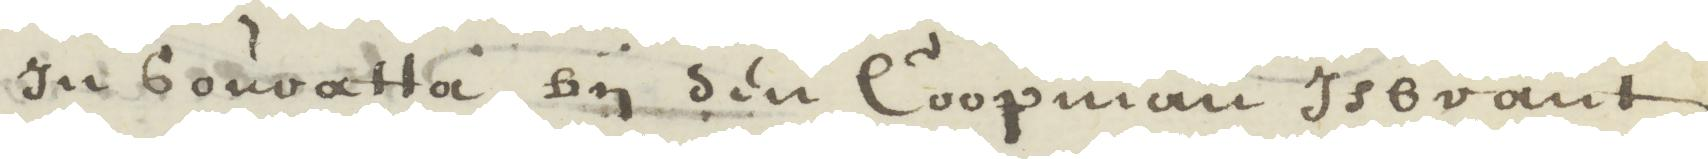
In souratta bij den Coopman Jsbrant
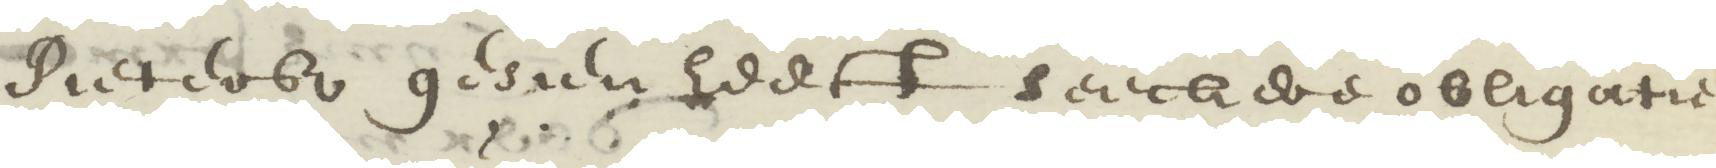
Pieterse gesien heeft seeckere obligatie
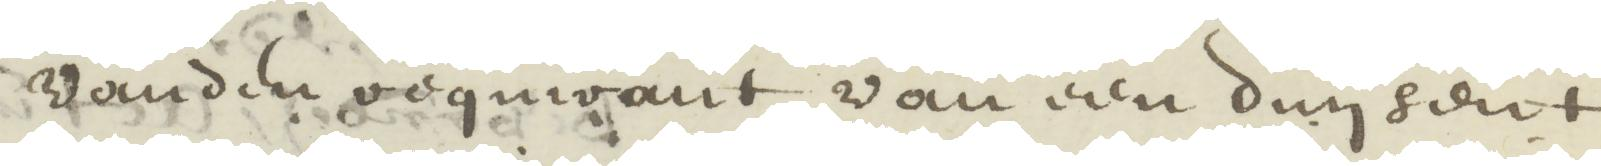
van den requirant van een duijsent
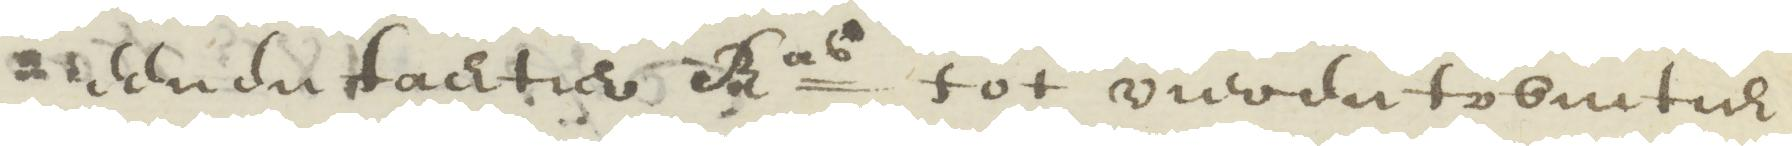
eenen tachtich R=as tot vieren twintich
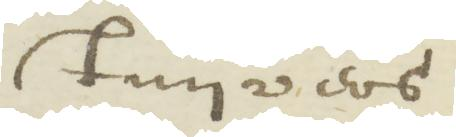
stuijvers
